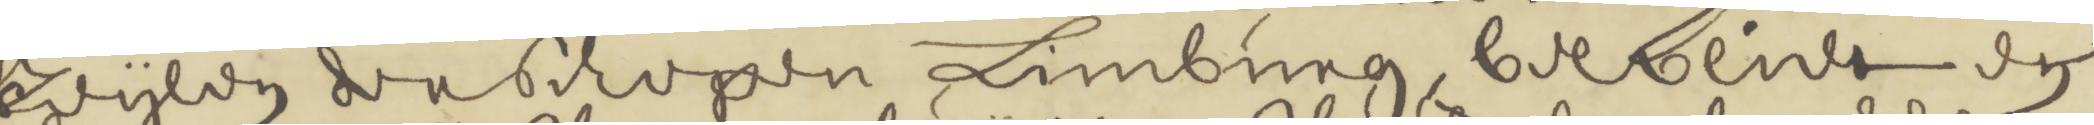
zeijlen der schepen Limburg, belvliet en
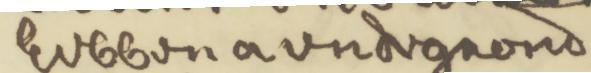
hebben aen de grond
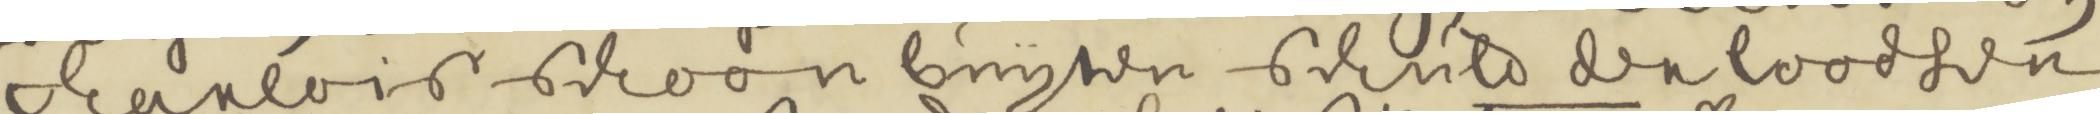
charlois schoon buijten schuld der loodsen
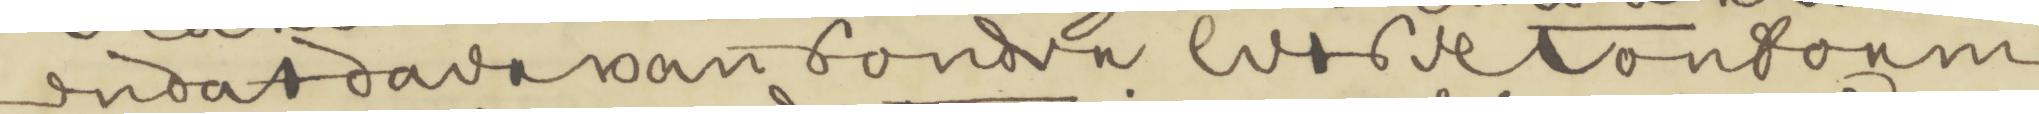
en dat daer van sonder letsel conform
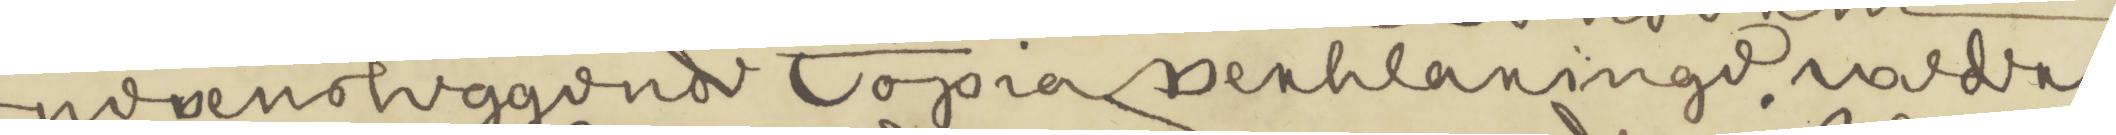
de nevensleggende Copia verklaringe weder
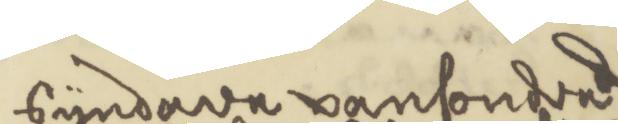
sijn daer van sonder
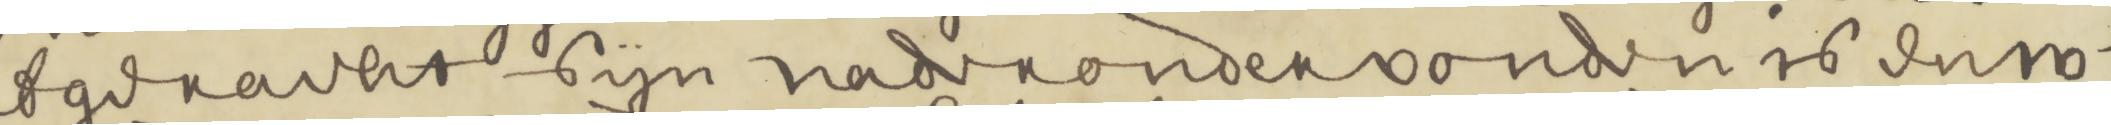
afgeraekt sijn nader ondervonden is en w'
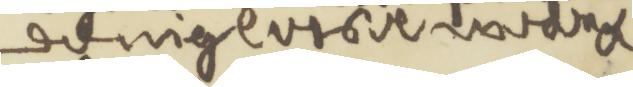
eenig letsel weder
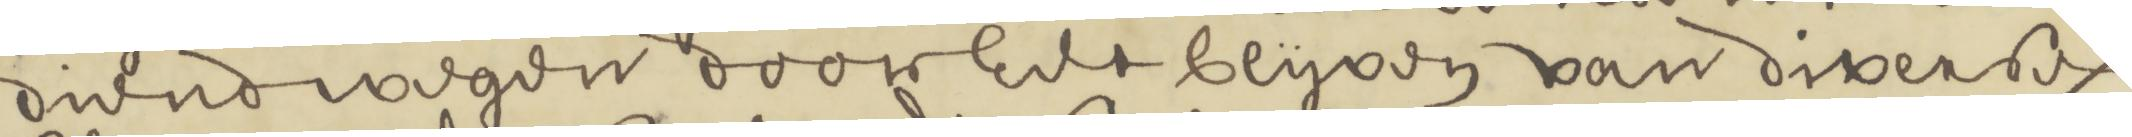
diendwegen door het blijven van diverse
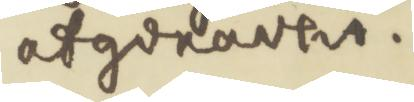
afgeraekt.
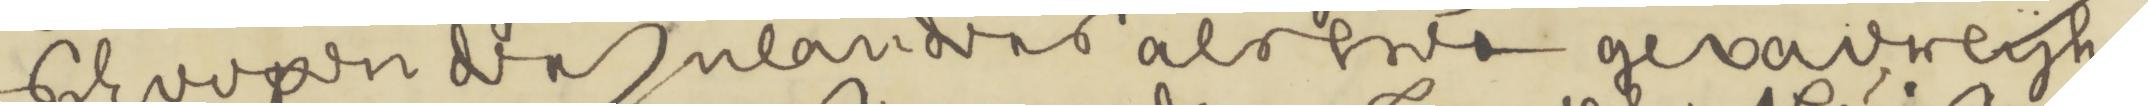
scheepen der jnlanders als het gevaerlijk
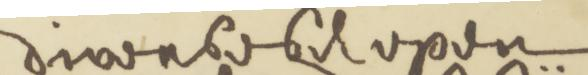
diverse schepen
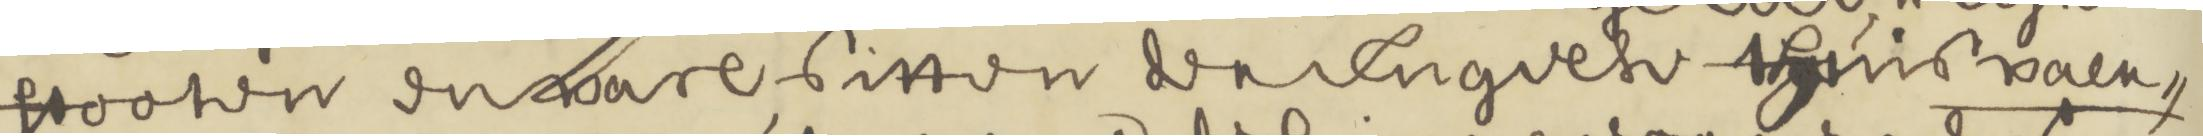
stooten en vast sitten der Engelse thuis vaer„
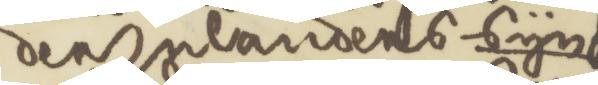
der jnlanders sijn
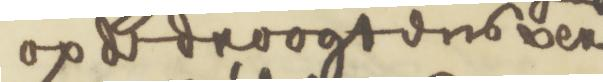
op de droogtens ver
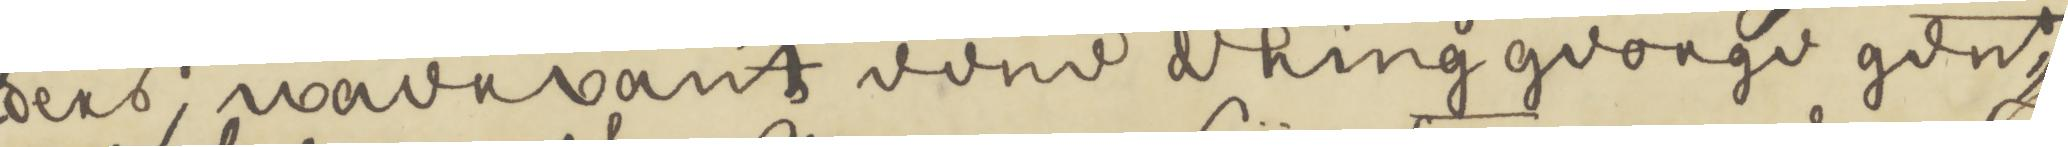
ders, waer van’t eene de king george gen„t
